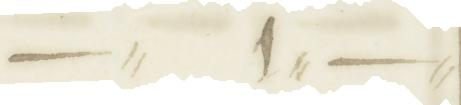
—„ 1„—„
